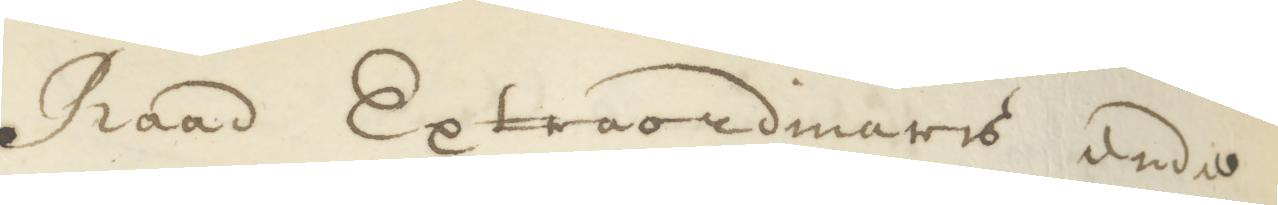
Raad Extraordinaris ende
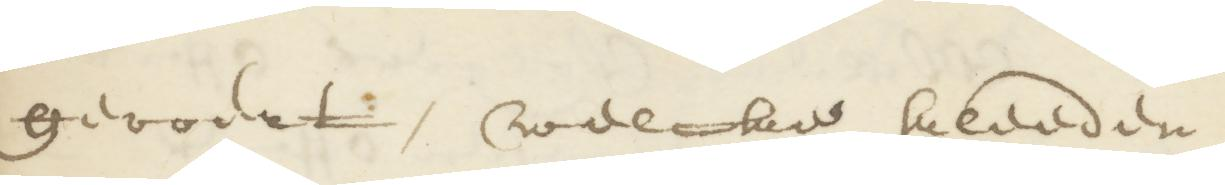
gevoert, welcke kleeden
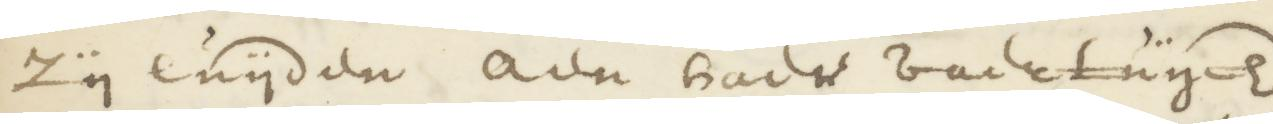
zij luijden aen haer vaertuijch
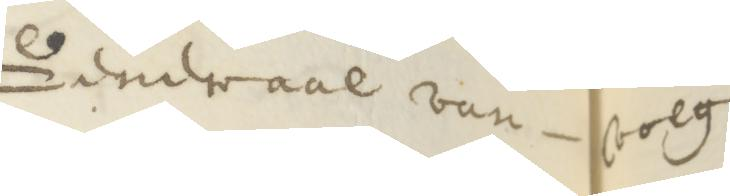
Generaal van —
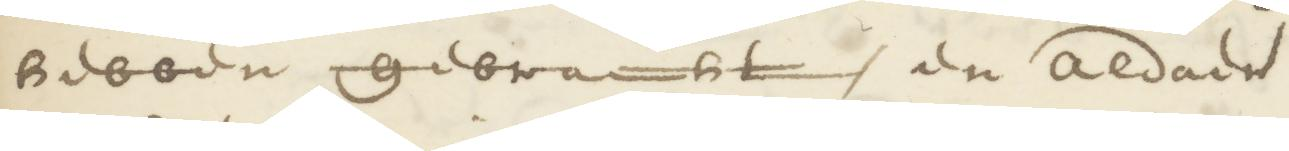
hebben gebracht, en aldaer
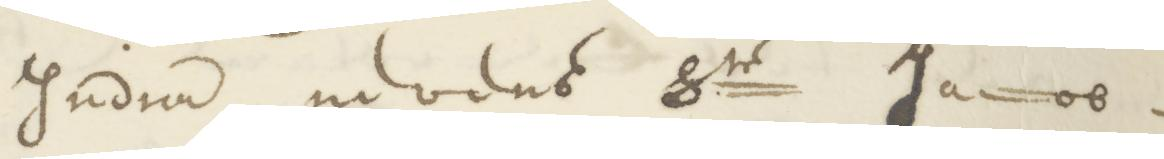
Jndia nevens h=r Jacob
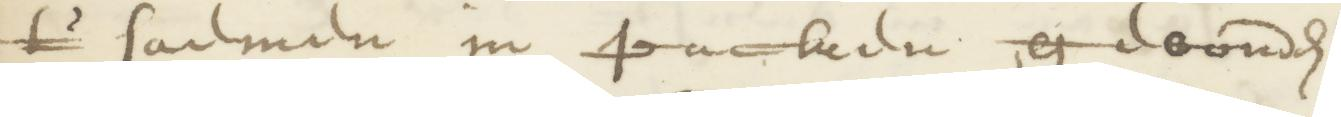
t' saemen in packen gebonden
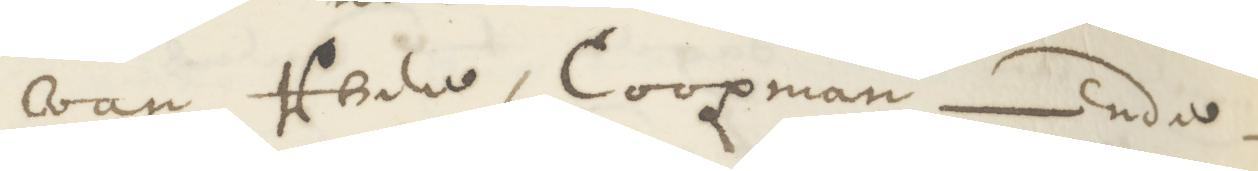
van Rhee, Coopman ende
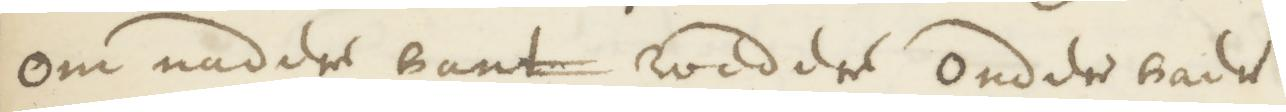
om nader hant weder onder haer
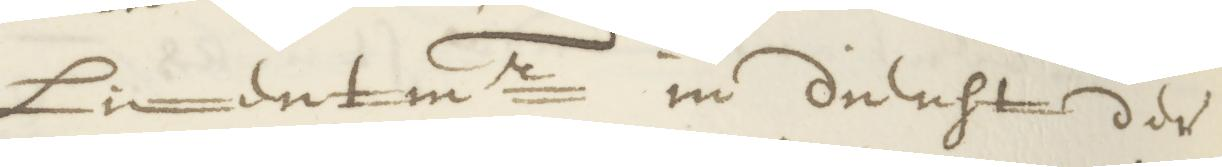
Licentm=r in dienst der
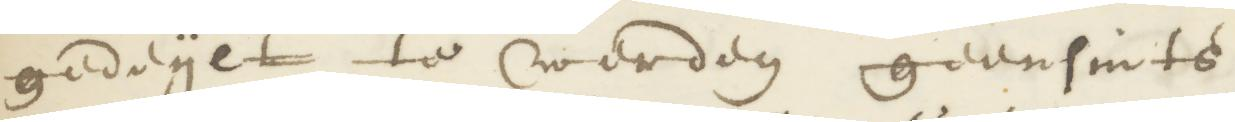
gedeijlt te werden geensints
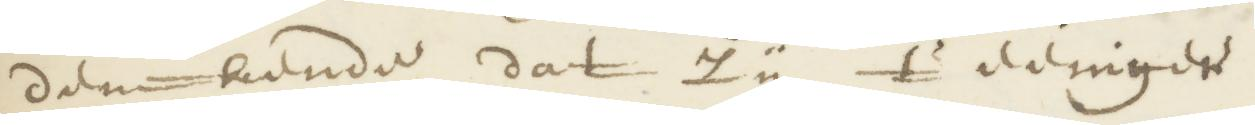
denckende dat zij t' eeniger
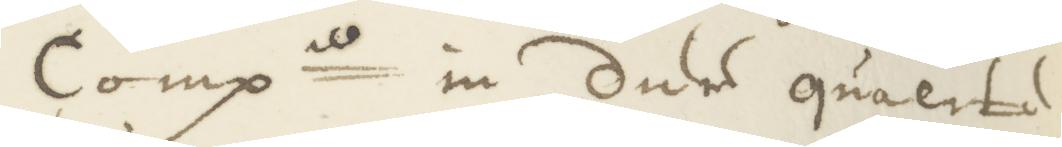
E: Comp=e in dier qualite
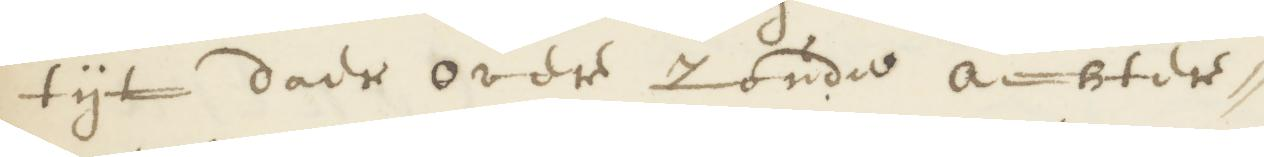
tijt daer over zoude achter„
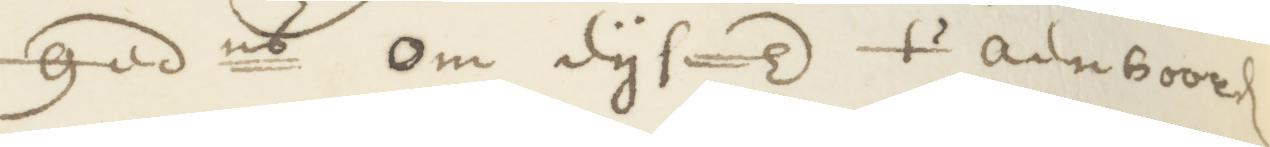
ged=ns om eijsch t' aenhooren
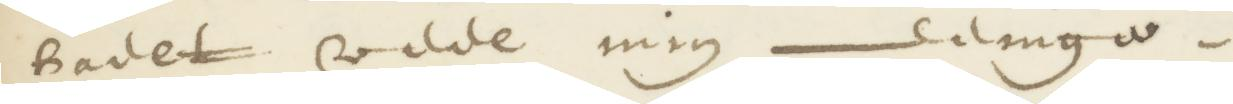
haelt veel min eenige —
